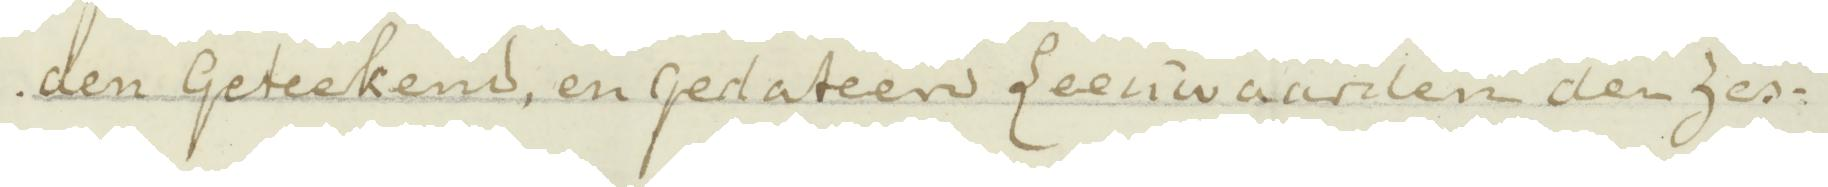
.den Geteekend, en gedateerd Leeuwaarden den zes=
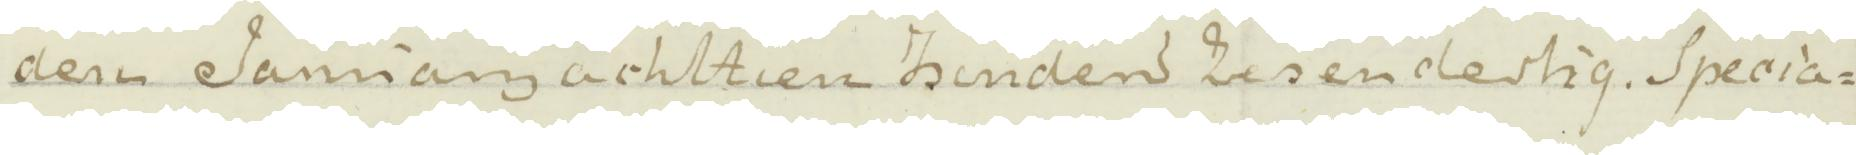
den Januarij achttien honderd Zes en dertig, specia
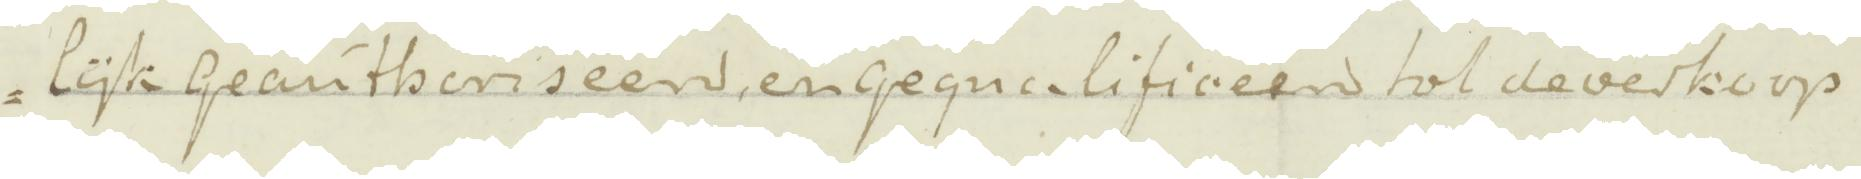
=lijk geauthoriseerd en gequalificeerd tot de verkoop
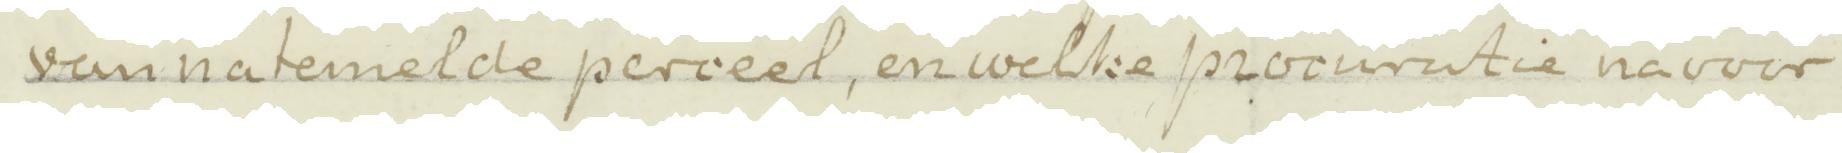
van na te melde perceel, en welke procuratie na voor
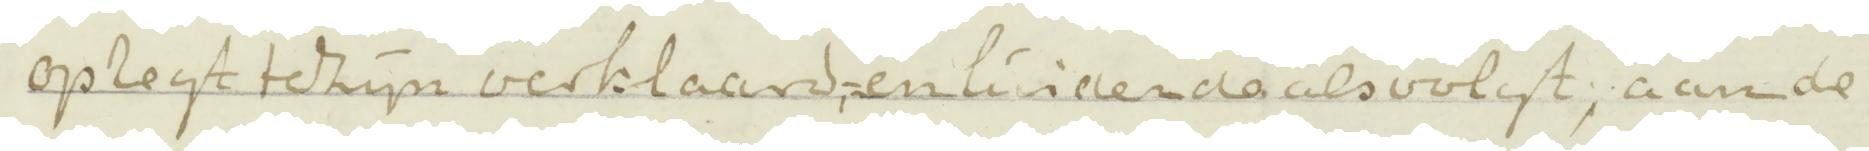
op regt te zijn verklaard,= en luidende als volgt, aan de
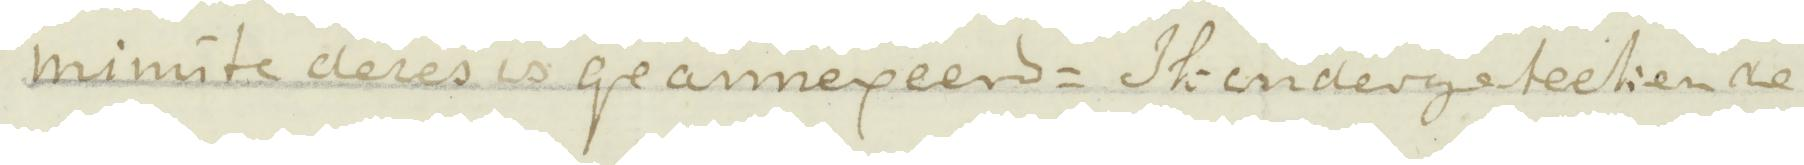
minute dezes is geannexeerd= Ik ondergeteekende
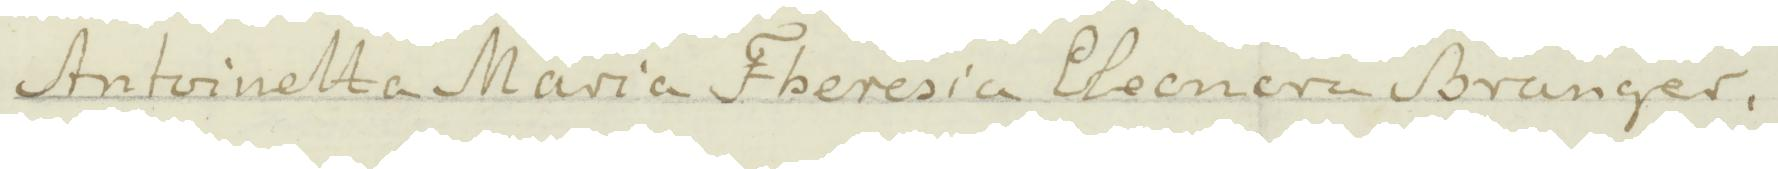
Antoinetta Maria Theresia Eleonora Branger,
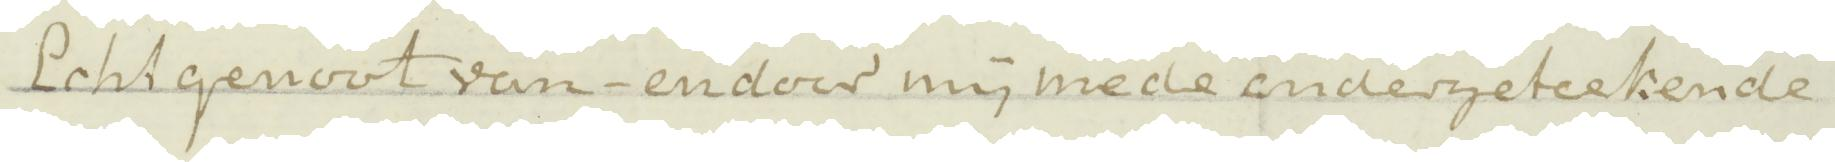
Echtgenoot van - en door mij mede ondergeteekende
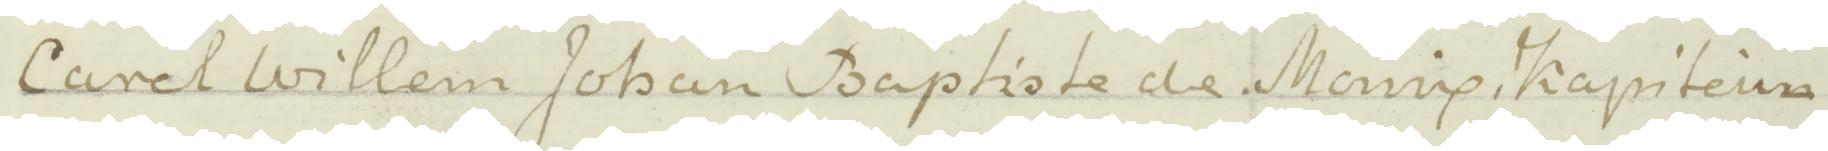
Carel Willem Johan Baptiste de Monix, Kapitein
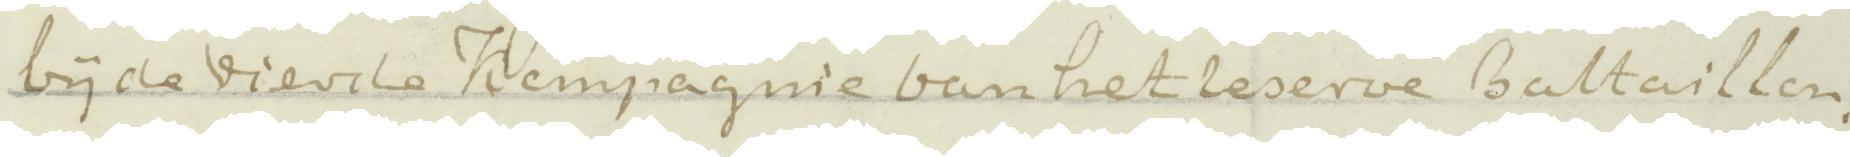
bij de vierde Kompagnie van het reserve Battaillon
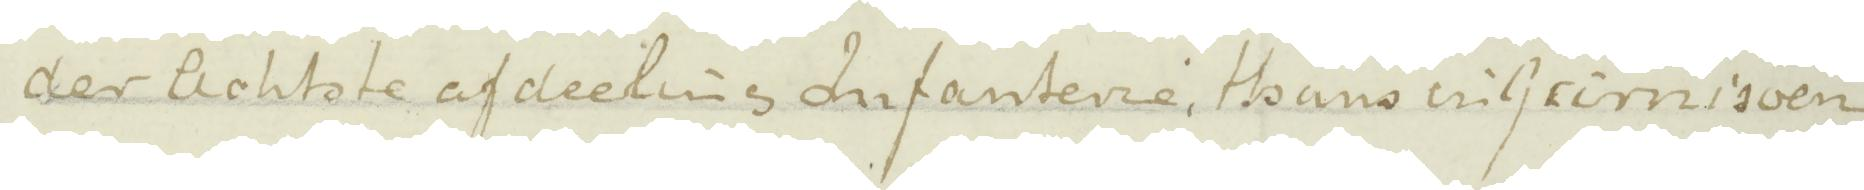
der Achtste afdeeling Infanterie, thans in garnisoen
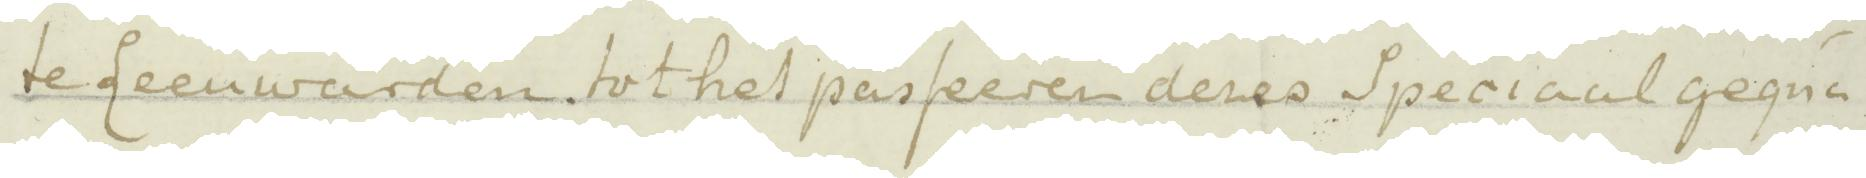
te Leeuwarden. tot het passeeren dezes speciaal gequa
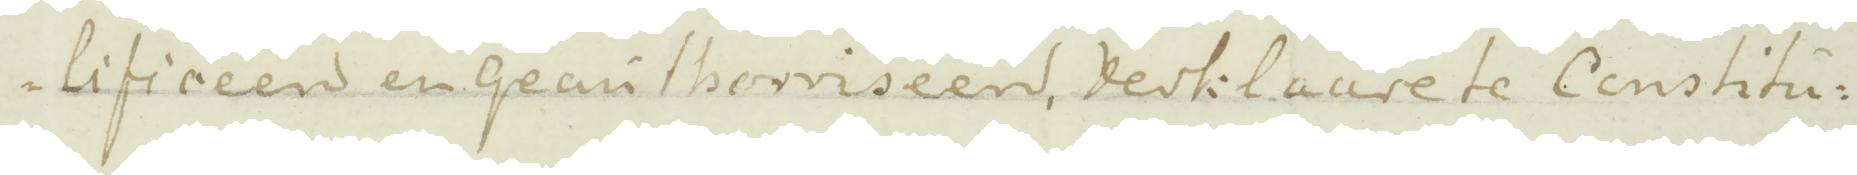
„lificeerd en geauthorriseerd, verklaare te Constitu:
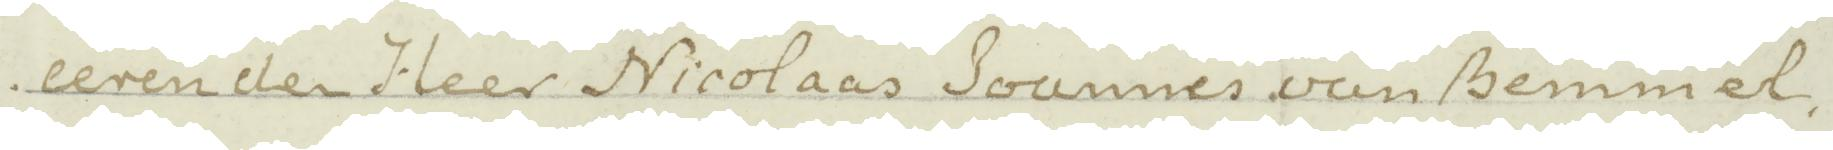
„eeren den Heer Nicolaas Joannes van Bemmel,
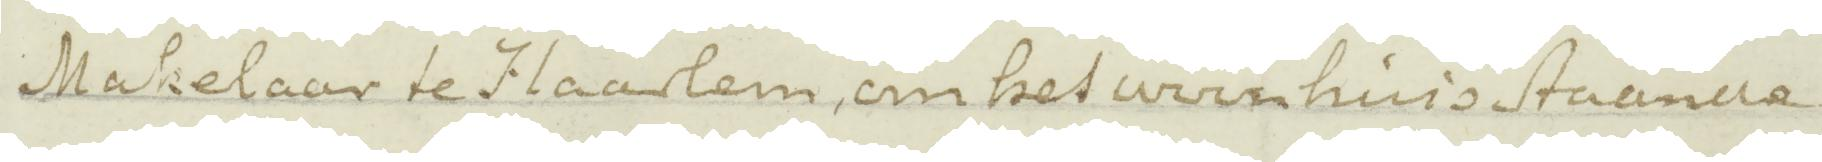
Makelaar te Haarlem, om het woonhuis staande
